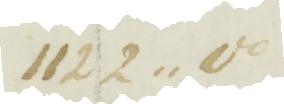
112 2 „ do
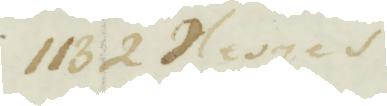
113 2 Vesjes
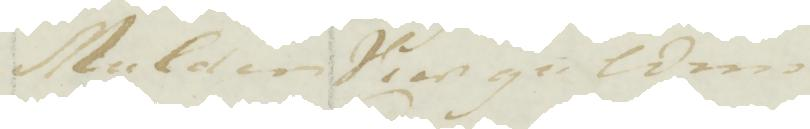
Mulder Vier guldens
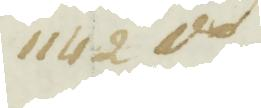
114. 2 d_o
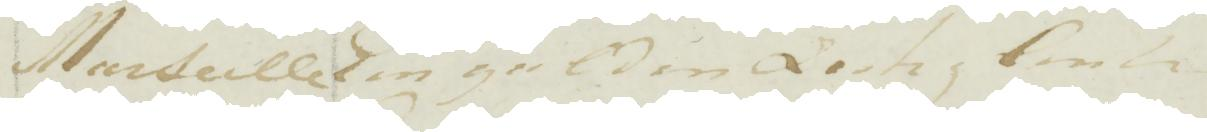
Marseille Een gulden Zestig Cents
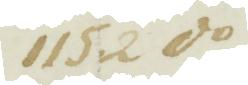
115.2 d_o
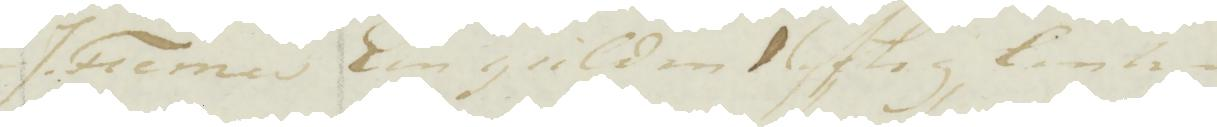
J. Tiemes Een gulden Vyftig Cents
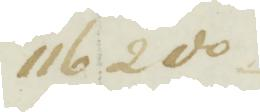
116 2 do
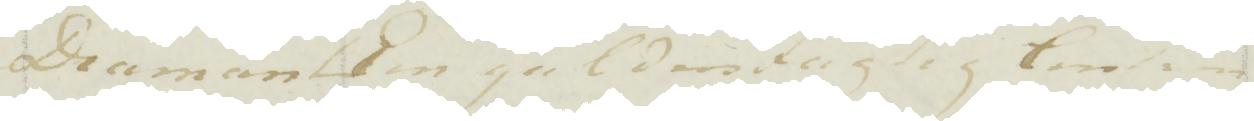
Diamant Een gulden tagtig Cents
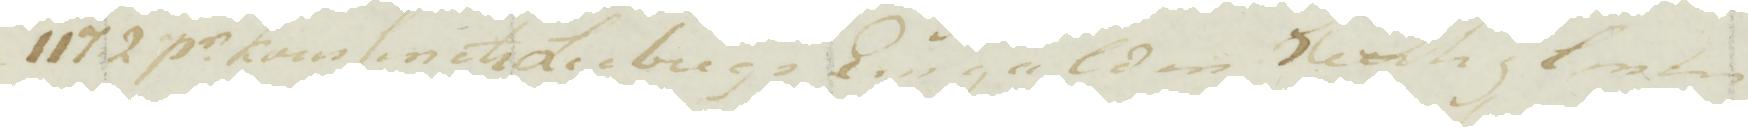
117.2 p.s kousse net Leebergs Een gulden Veertig Cents
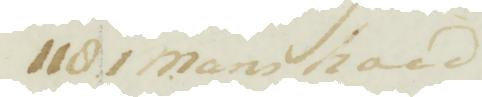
118:1 mans hoed
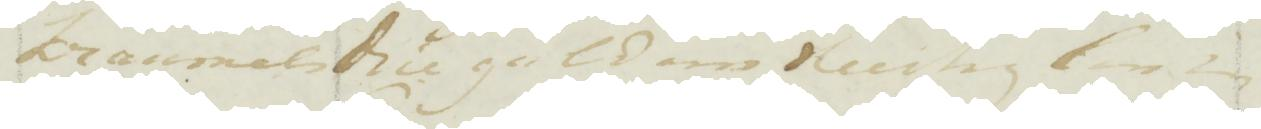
krauwels drie guldens Veertig Cents
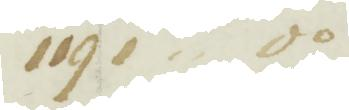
119 1 „ do
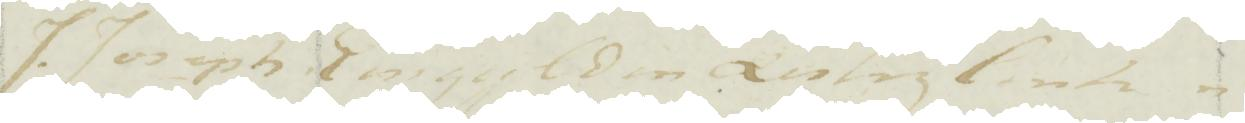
J. Joseph Een gulden zestig Cents
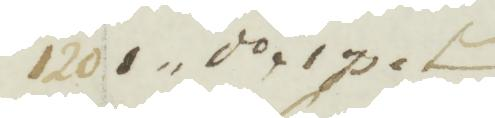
120 1 „ do en 1 pet
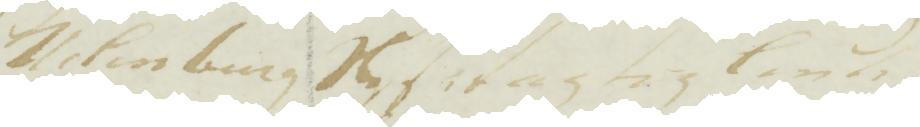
Uilenburg Vyf en tagtig Cents
